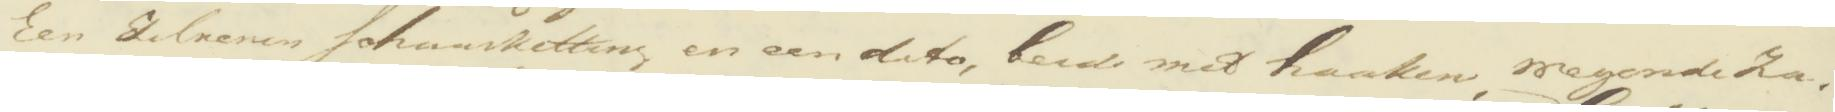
Een zilveren schaarketting en een dito, beide met haaken wegende za
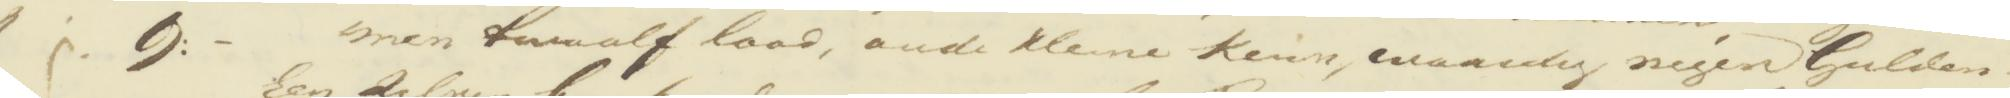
„ 9: – men twaalf lood, oude kleine keur, waardig negen Gulden
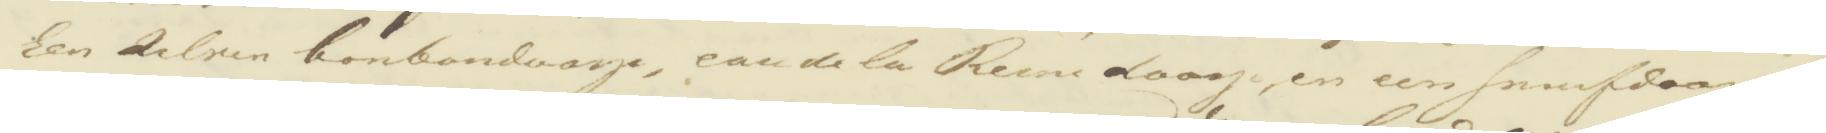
Een zilver bonbondoosje, eau de la Reine doosje, en een snuifdoosje,
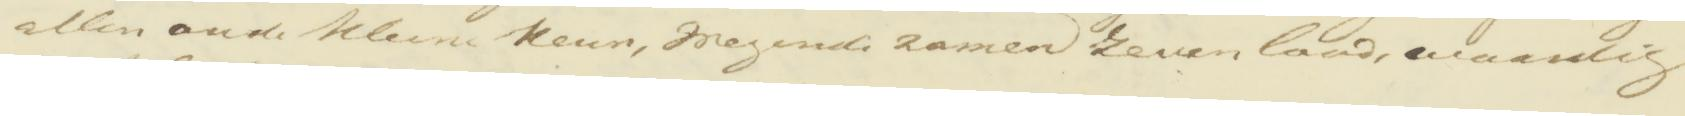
allen oude kleine keur, wegende zamen zeven lood, waardig
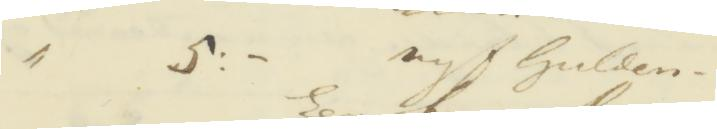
„ 5: – vyf Gulden
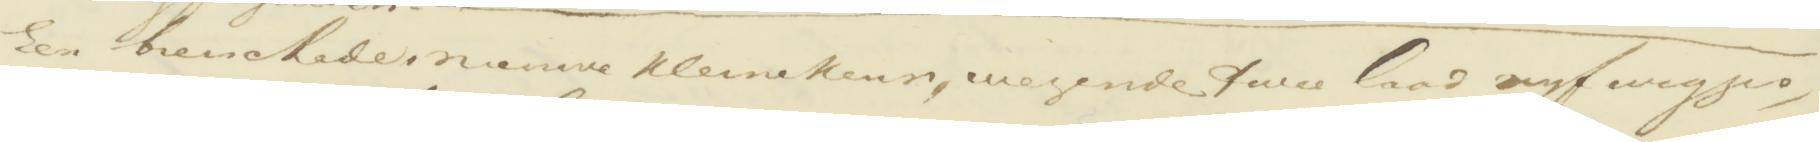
Een breischede, nieuwe kleine keur, wegende twee lood vyf wigjes,
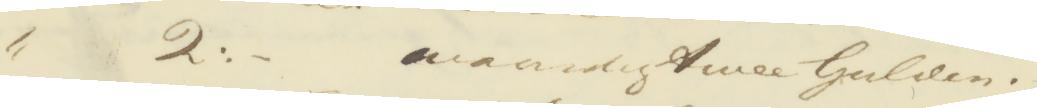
„ 2: – waardig twee Gulden.
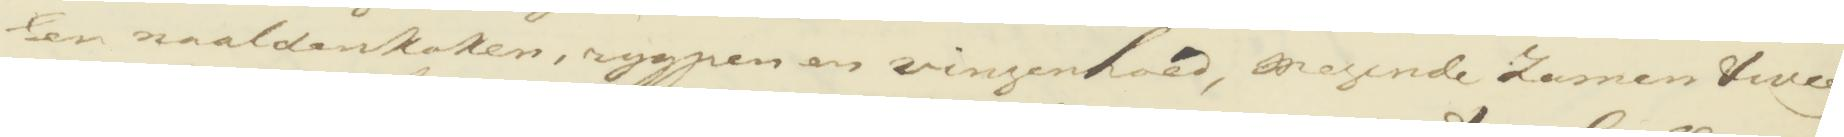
Een naaldenkoker, rygpen en vingerhoed, wegende zamen twee
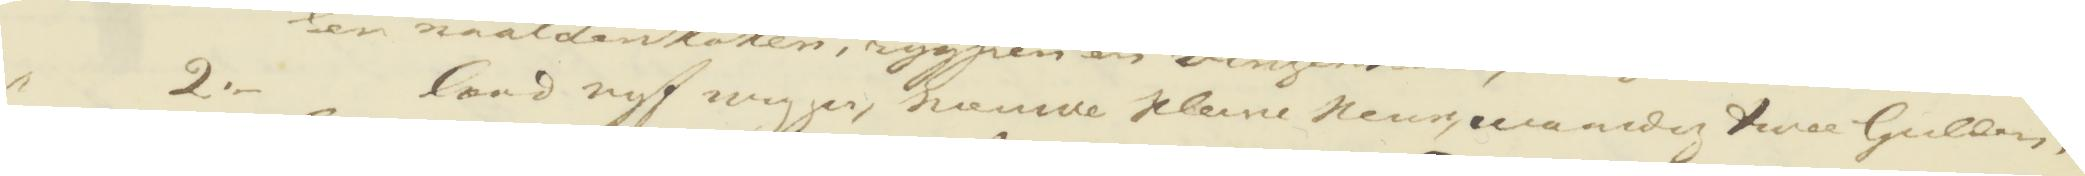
„ 2„– lood vyf wigjes, nieuwe kleine keur, waardig twee Gulden,
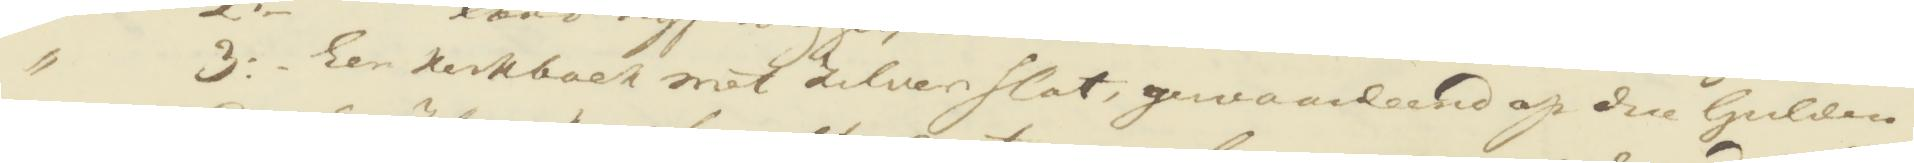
„ 3: - Een kerkboek met zilver slot, gewaardeerd op drie Gulden
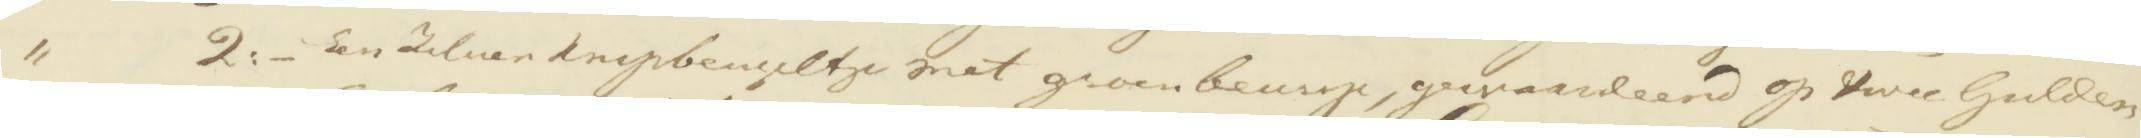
„ 2: – Een zilver knipbeugeltje met groen beursje, gewaardeerd op twee Gulden
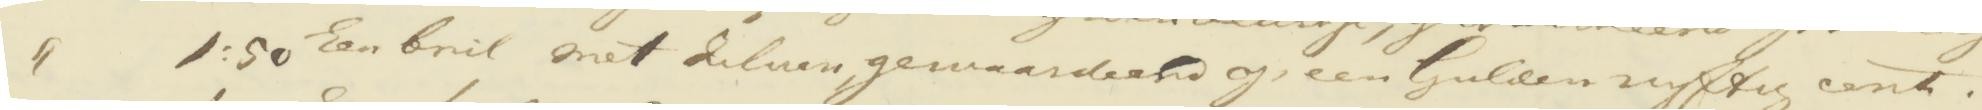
„ 1:50 Een bril met zilver gewaardeerd op een Gulden vyftig cent
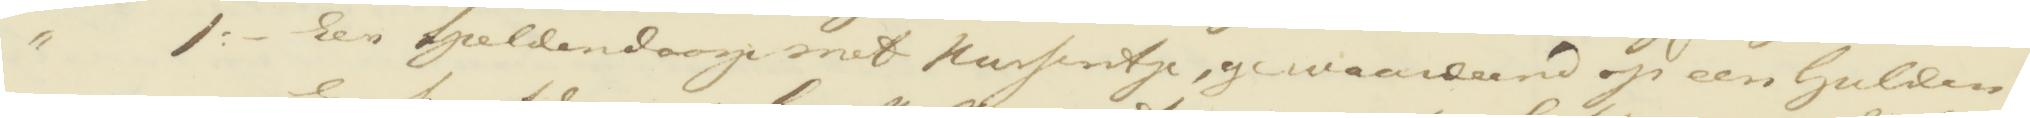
„ 1: – Een speldendoosje met kussentje, gewaardeerd op een Gulden.
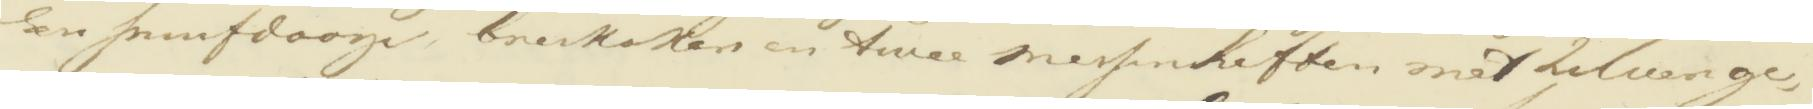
Een snuifdoosje, breikoker en twee messenheften met zilven ge-
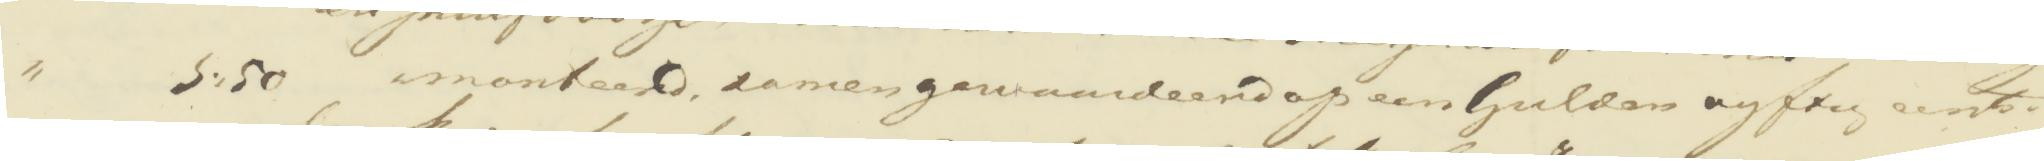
„ 5:50 monteerd, zamen gewaardeerd op een Gulden vyftig cents
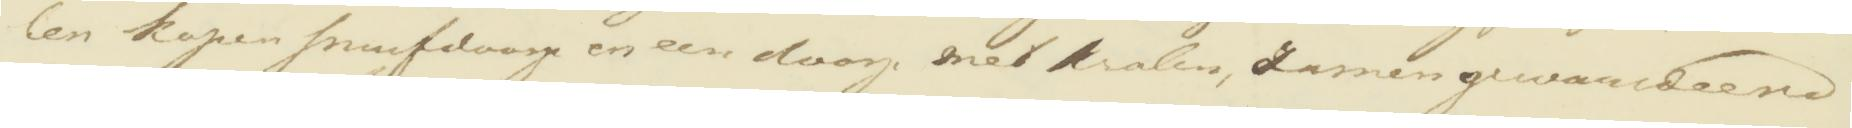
Een koper snuifdoosje en een doosje met kralen, zamen gewaardeerd
